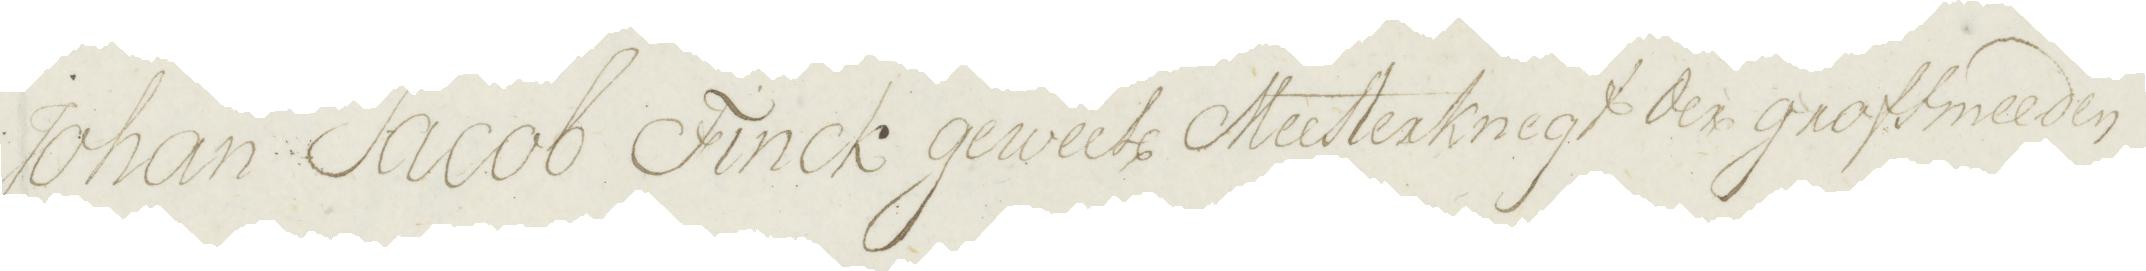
Johan Iacob Finck geweese Meesterknegt der grofsmeeden
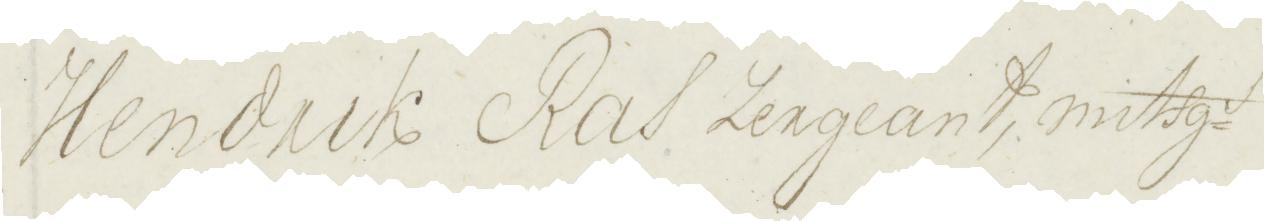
Hendrik Ras zergeant, mitsg=s
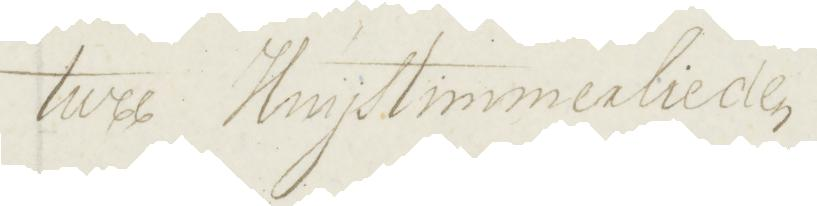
twee Huijstimmerlieden
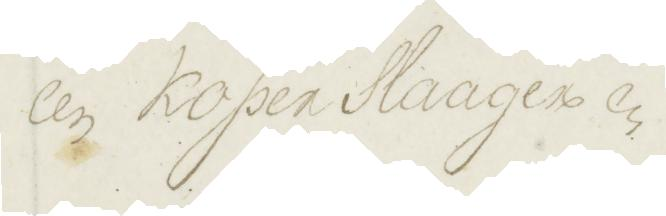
een koper slaager en
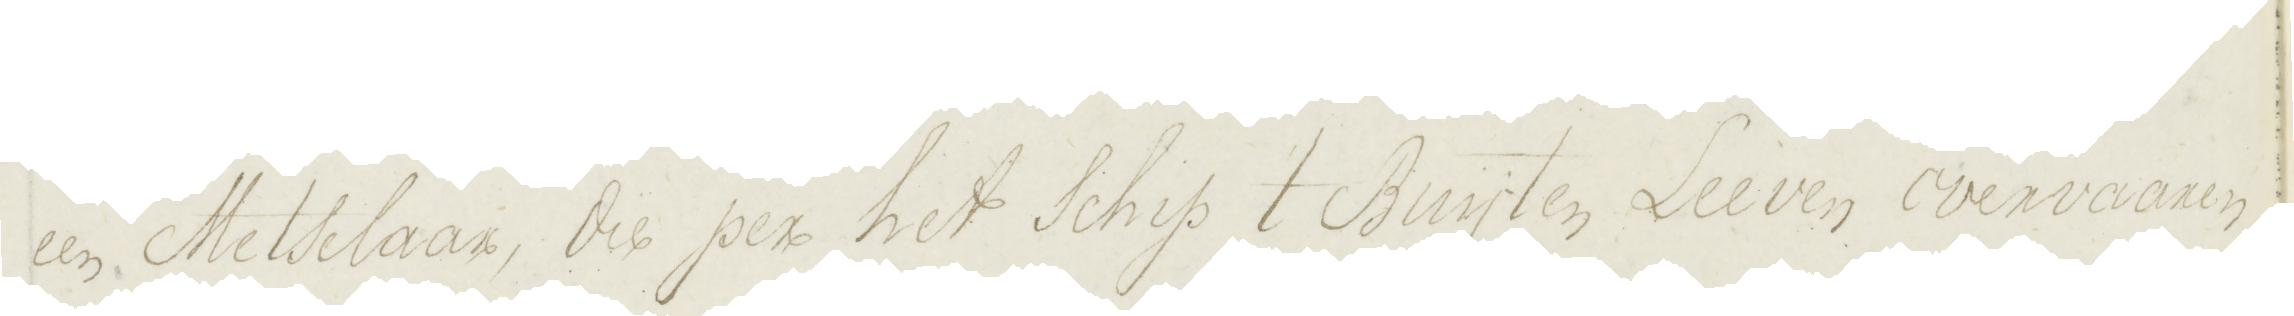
een Metselaar, die per het schip ’t Buijten Leeven overvaaren
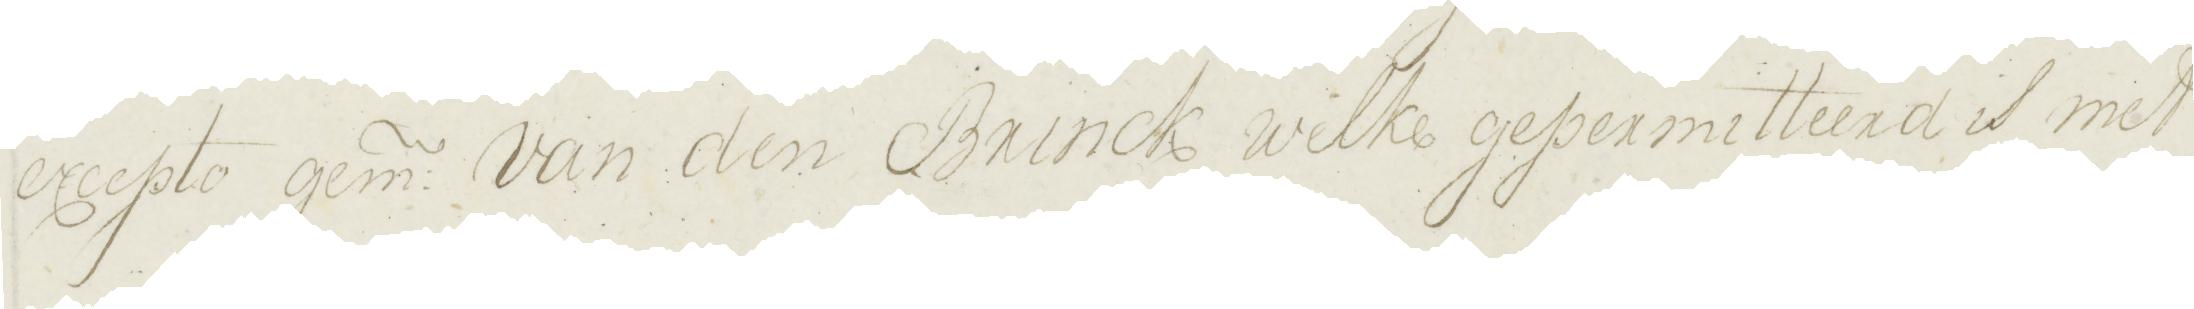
excepto gem: van den Brinck welke gepermitteerd is met
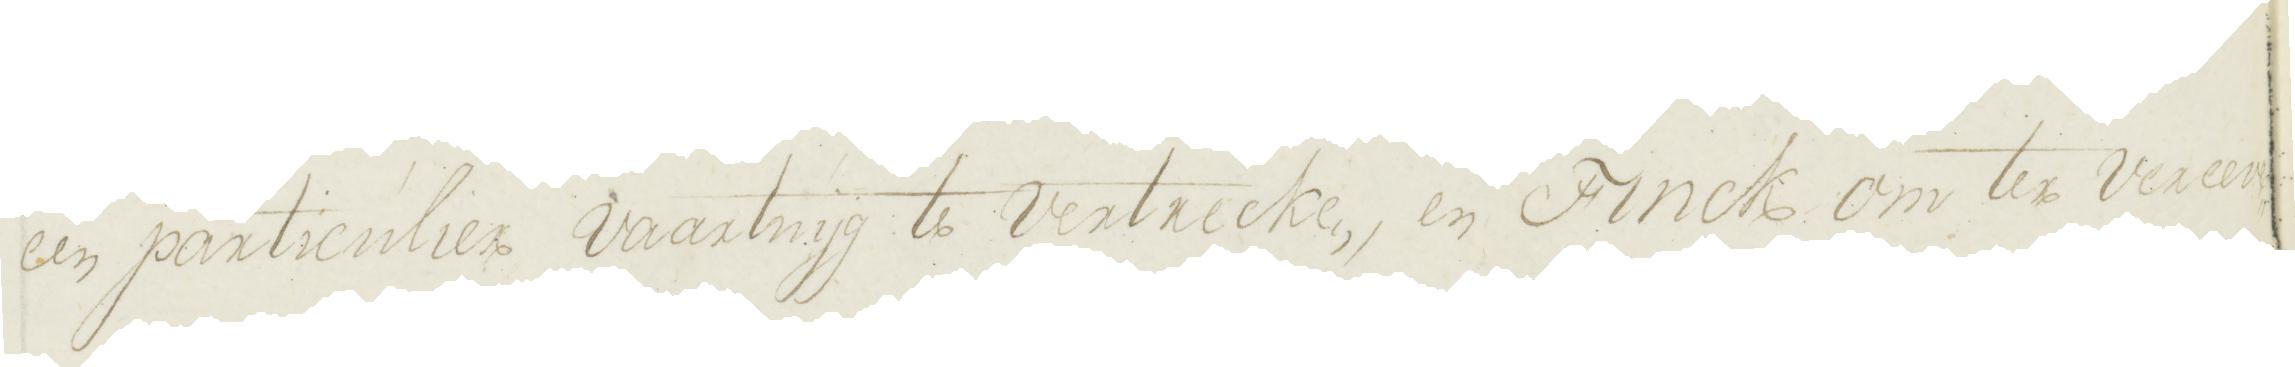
een particulier vaartuijg te vertrecken, en Finck om ter vereeve
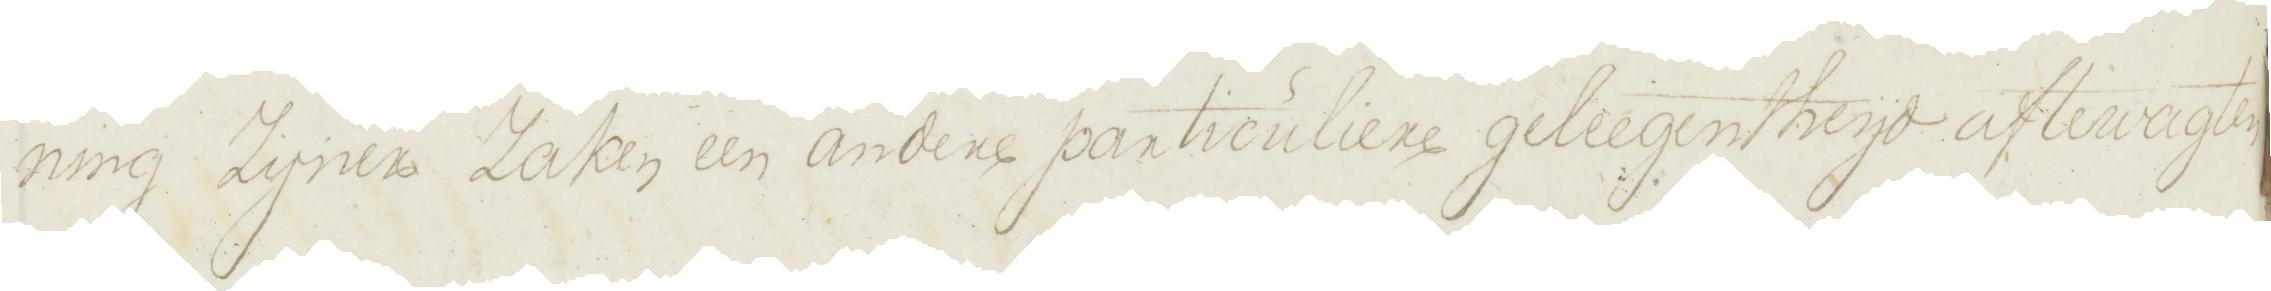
ning zijner zaken een andere particuliere geleegentheijd aftewagten
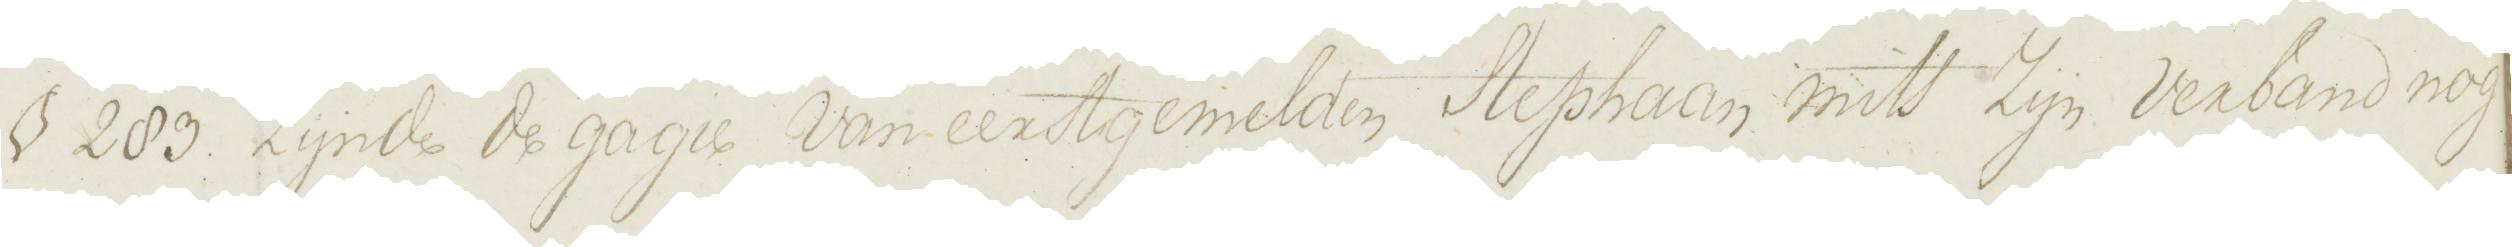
§ 283. zijnde de gagie van eerstgemelden Stephaan mits zijn verband nog
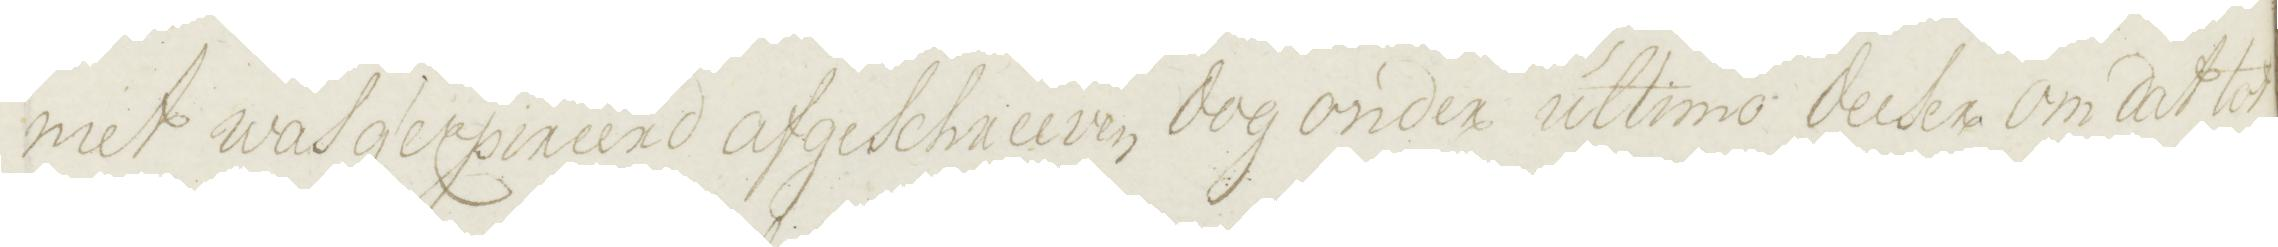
niet was g'expireerd afgeschreeven dog onder ultimo deeser om dat tot
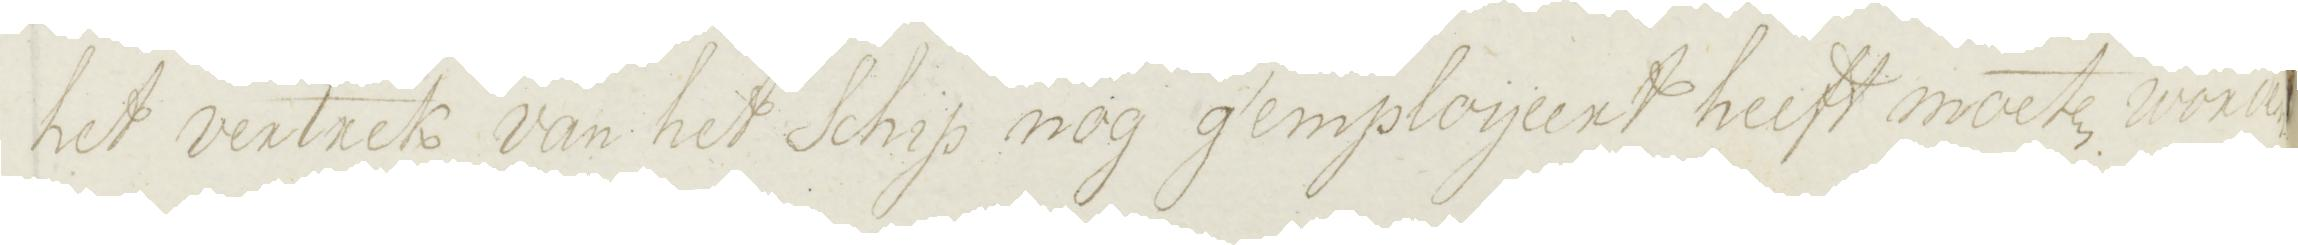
het vertrek van het schip nog g'emploijeert heeft moeten worde
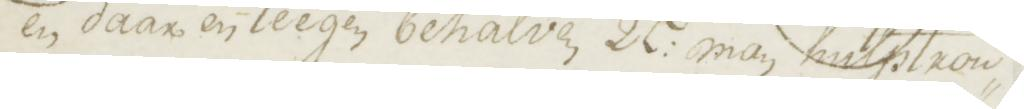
en daar en teegen behalven 25: man hulptrou„
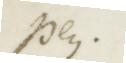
pen.
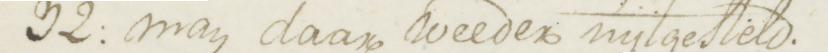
32: man daar weeder uijtgesteld.
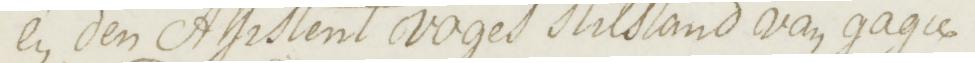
en den Assistent voges Stilstand van gagie
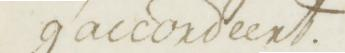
g'accordeert.
